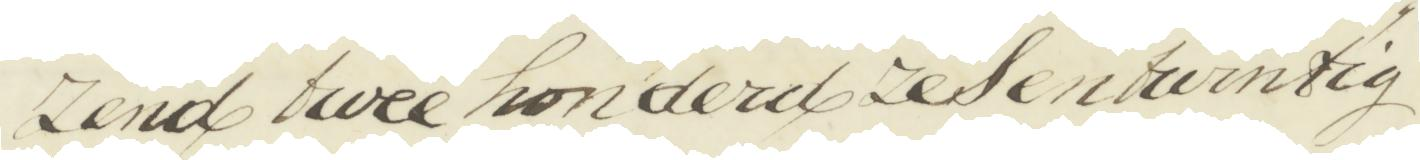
Zend twee honderd zes en twintig
